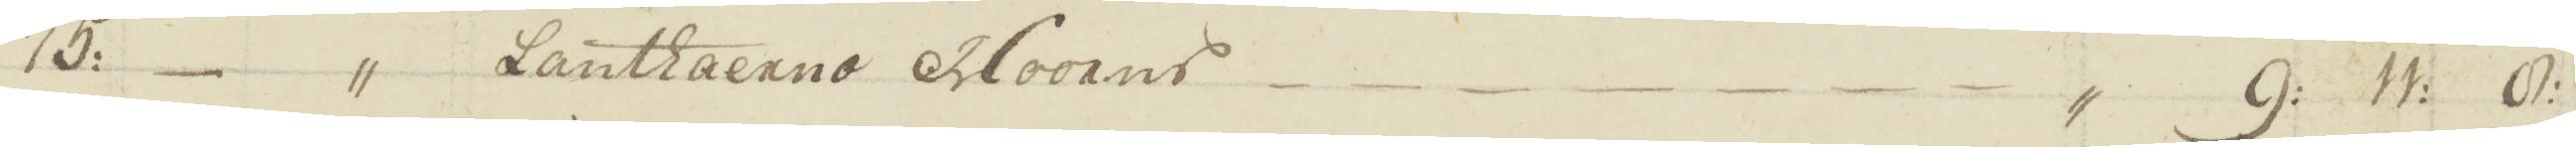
75: — „ Lanthaerne Hoorns - - - - - - - „ 9: 11: 8:
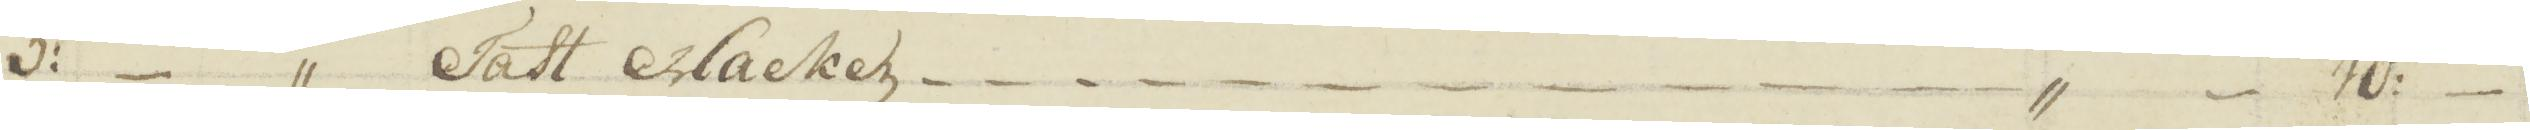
5: — „ Tast Haeken - - - - - - - - - - - - „ — 10: —
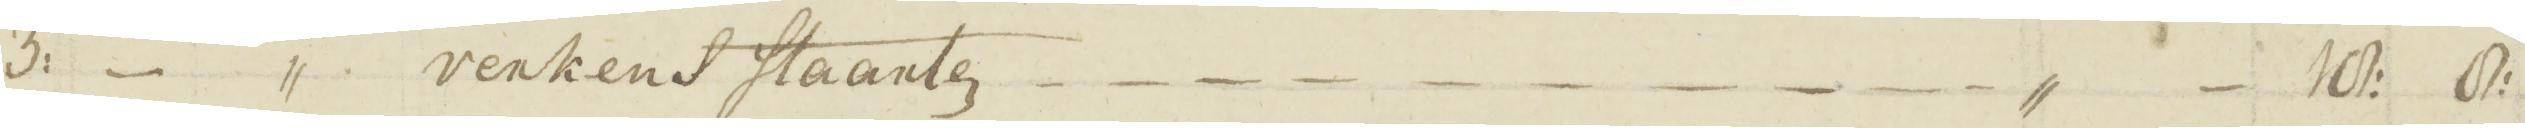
3: — „ verkens staarten - - - - - - - - - - „ — 18: 8:
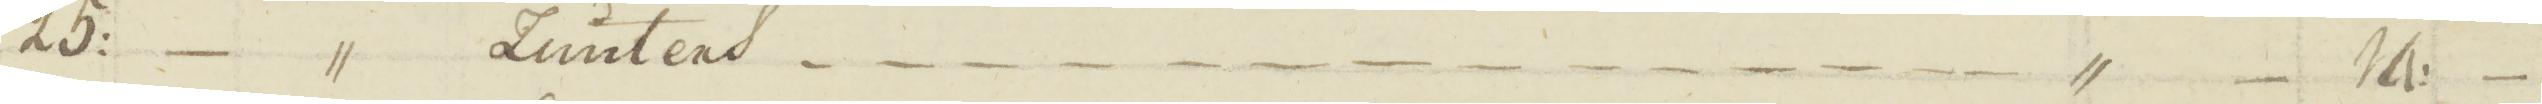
25. — „ Zunters - - - - - - - - - - - - - - „ — 14: —
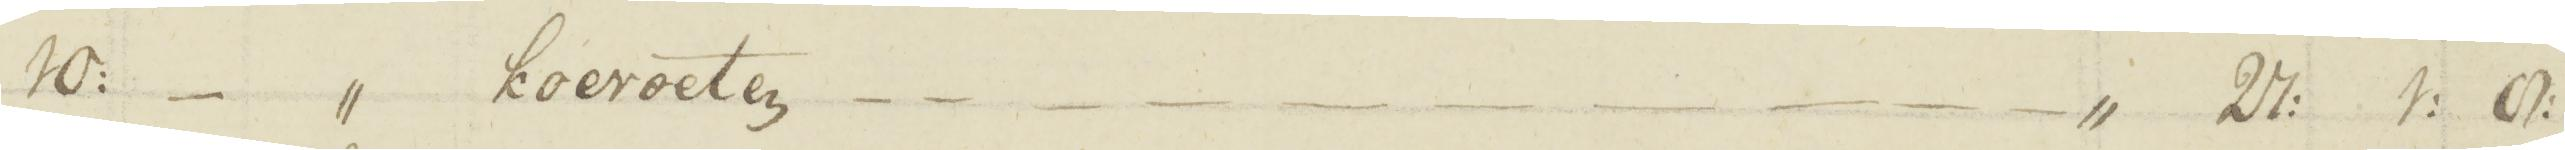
10: — „ koevoeten - - - - - - - - - - „ 27: 1: 8:
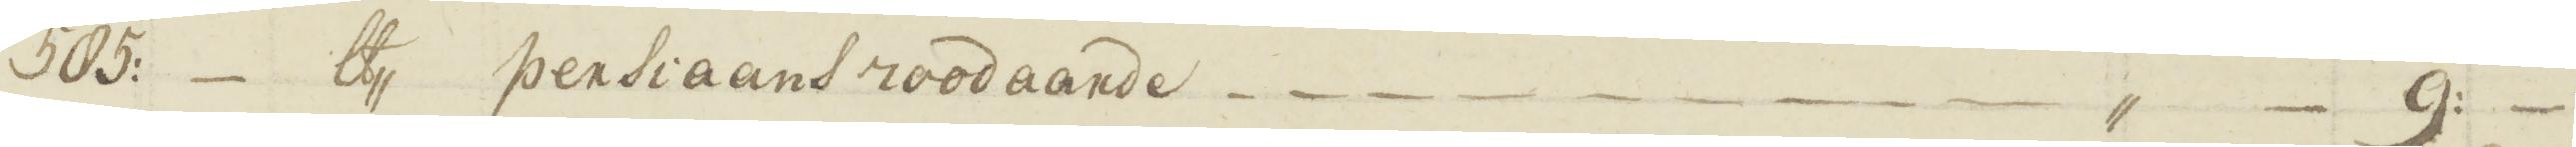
585: — lt„ persiaans roodaarde - - - - - - - - - „ — 9: —
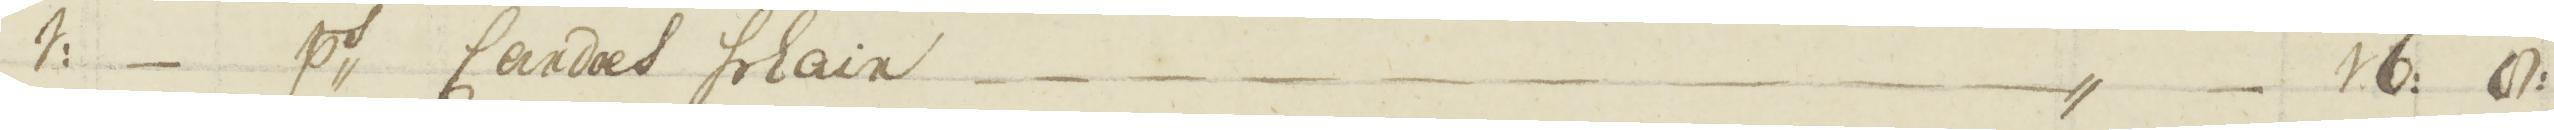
1: — p„s Cardoes schair - - - - - - - - - „ — 16: 8:
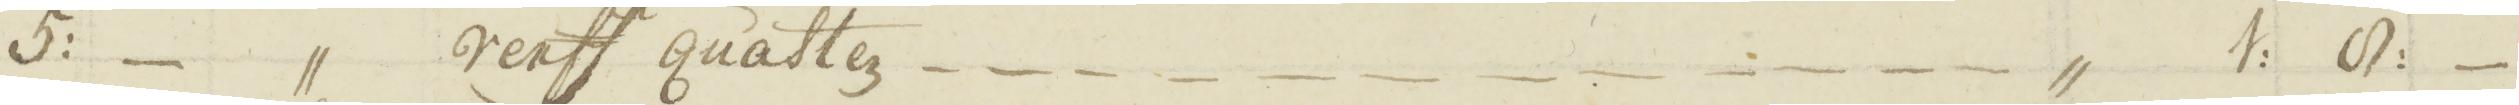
5: — „ verff quasten - - - - - - - - - - „ — 16: 8:
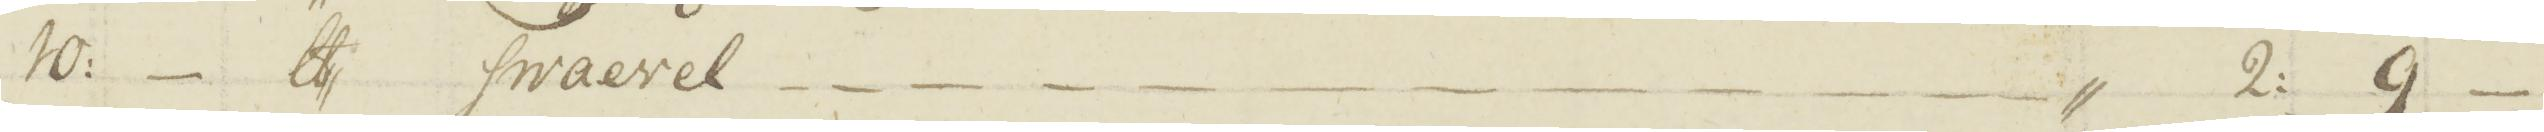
10: — lb„ swaevel - - - - - - - - - - - - „ 2: 9 —
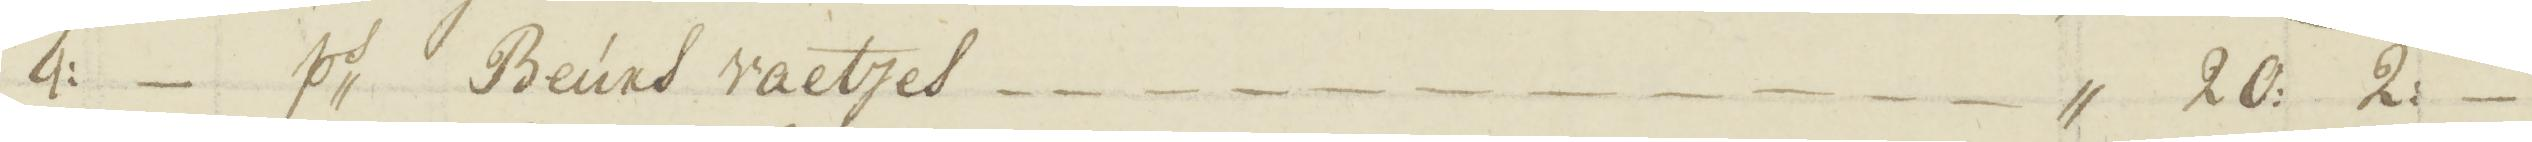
4: — p„s Beurs vaetjes - - - - - - - - - - - „ 20: 2: —
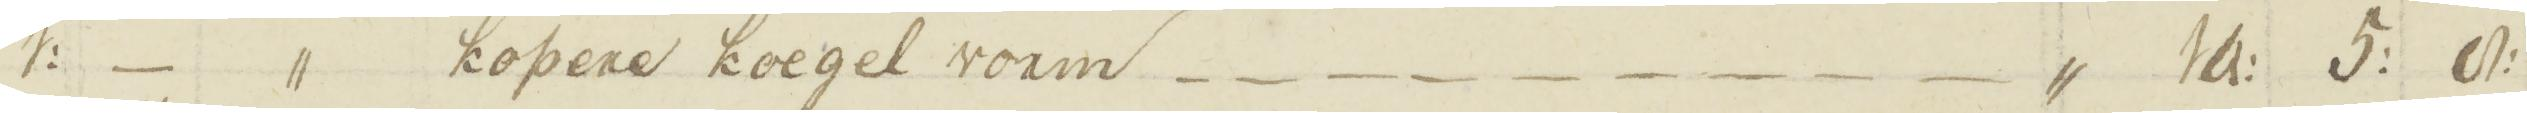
1: — „ kopere koegel vorm - - - - - - - - - „ 14: 5: 8:
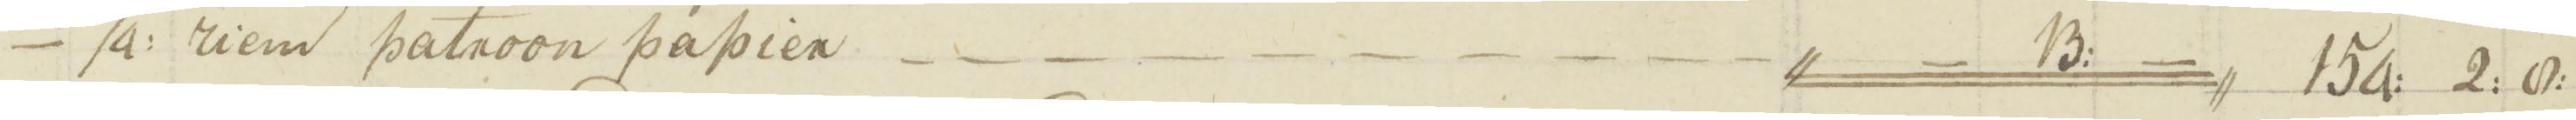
— ¼: riem patroon papier - - - - - - - - - - „ — 13: —„ 154: 2: 8:
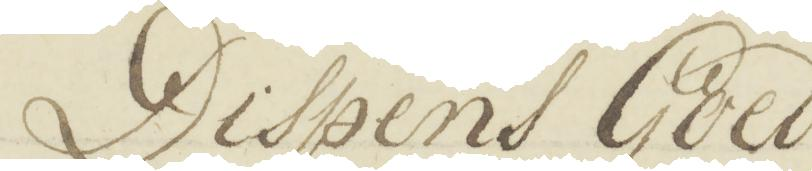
Dispens Goed
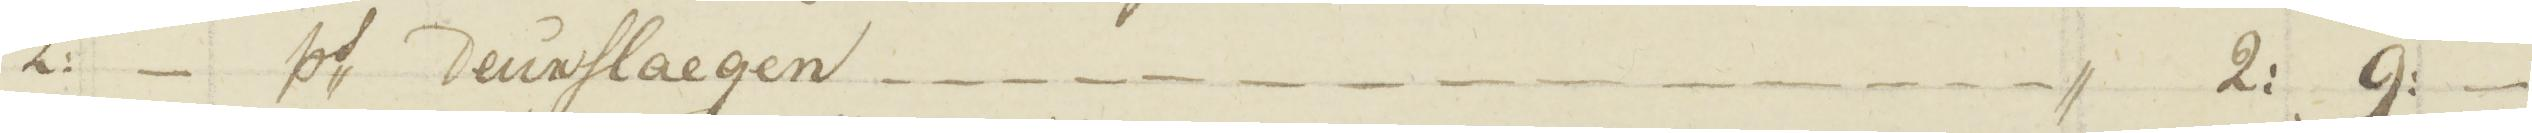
2: — p„s deurslaegen - - - - - - - - - - - - - - „ 2: 9: —
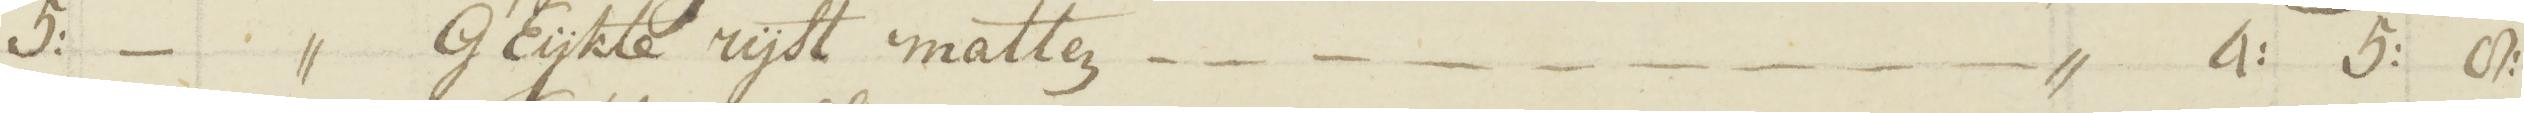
5: — „ G'Eijkte rijst matten - - - - - - - - - „ 4: 5: 8:
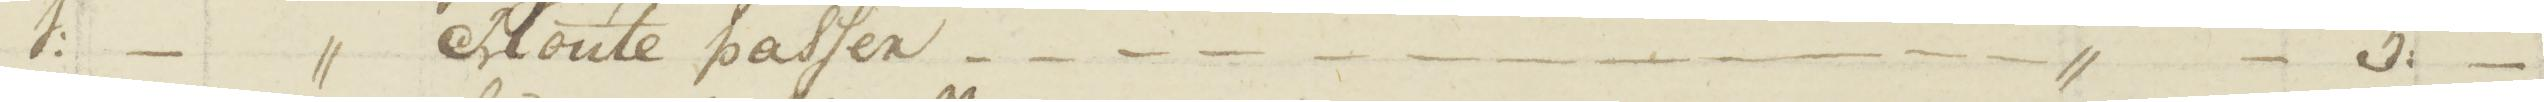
1: — „ Houte passer - - - - - - - - - - - - „ — 5: —
